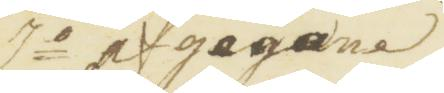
I=o afgegane
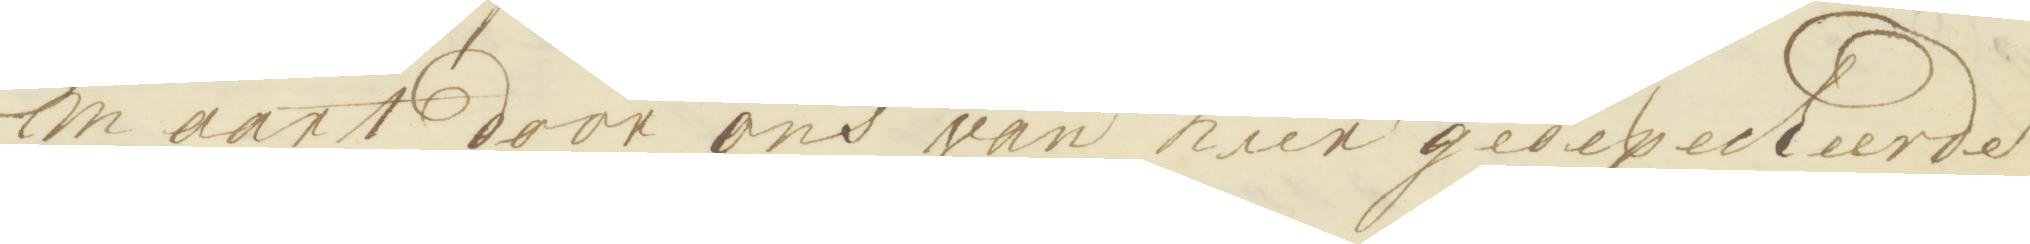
maart door ons van hier gedepecheerde
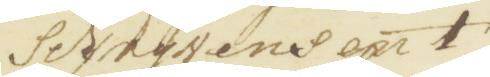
schryvens en t'
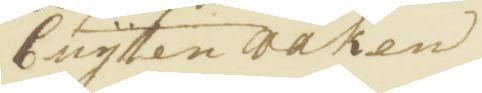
buijten raken
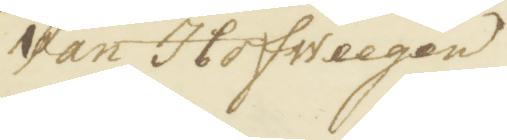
van Hofweegen
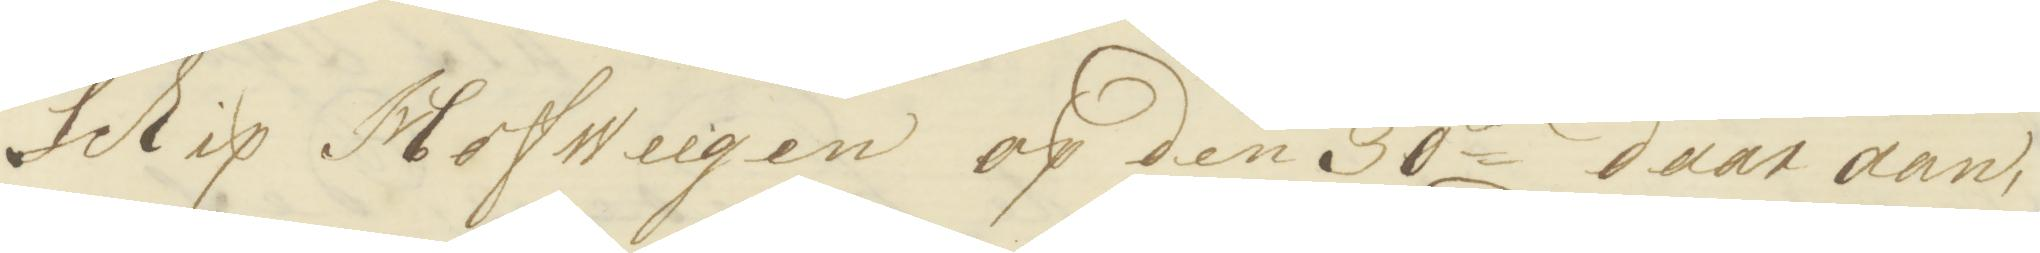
schip Hofweegen op den 30=e daar dan,
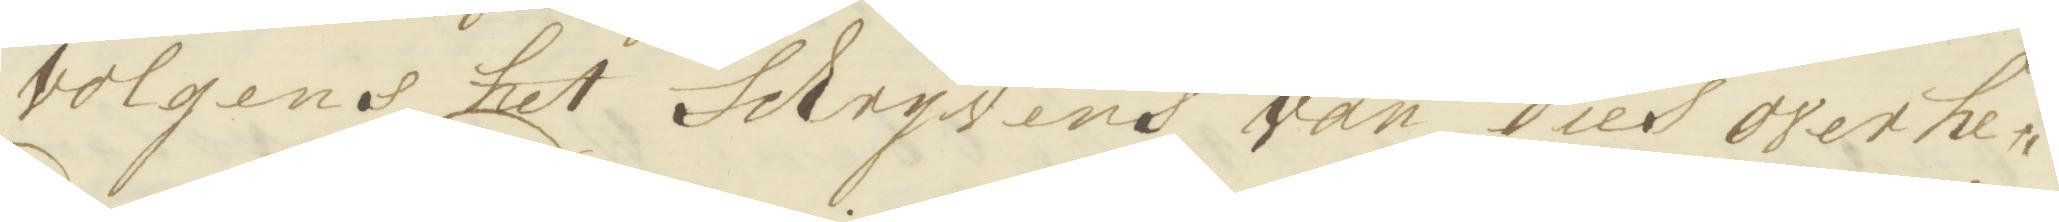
volgens het schryvens van dies overhe„
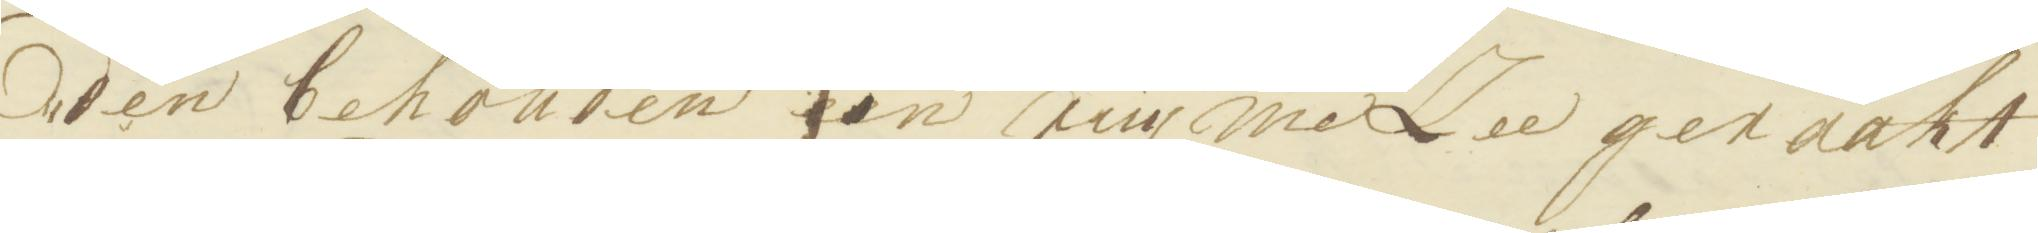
den behouden ein ruyme zee geraakt
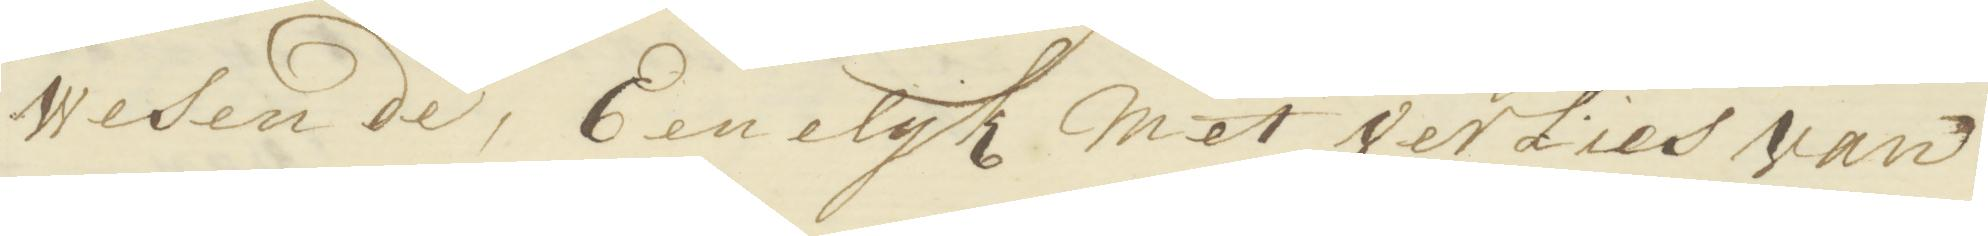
wesende, Eenelijk met verlies van
